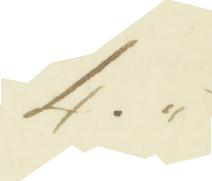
4.„
